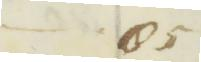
- .85
